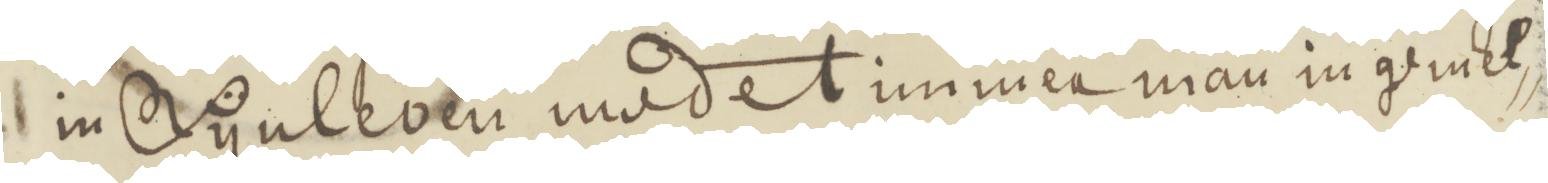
in Sijn leven mede timmerman in gemel„
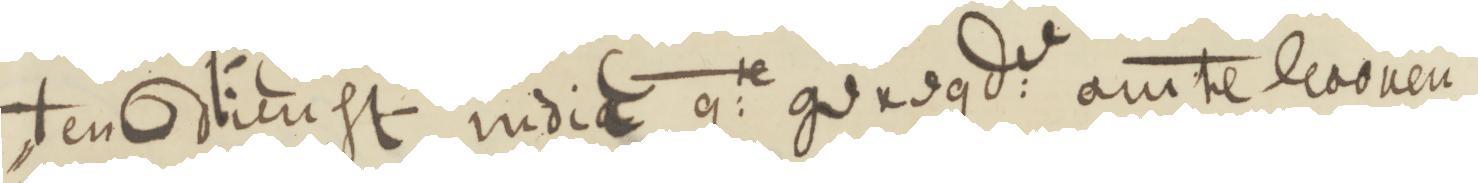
„ten dienst in die q:te gereqd:e om te hooren
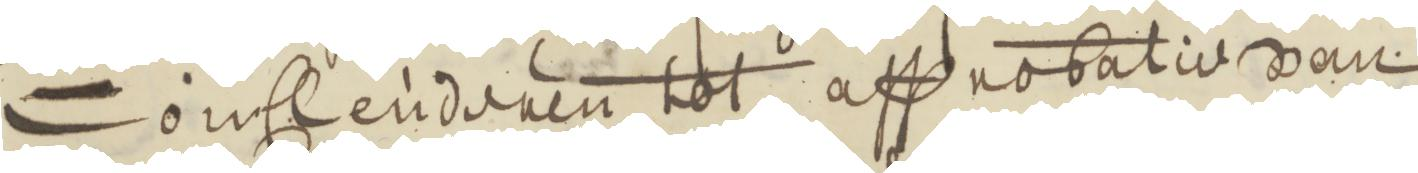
concleuderen tot approbatie van
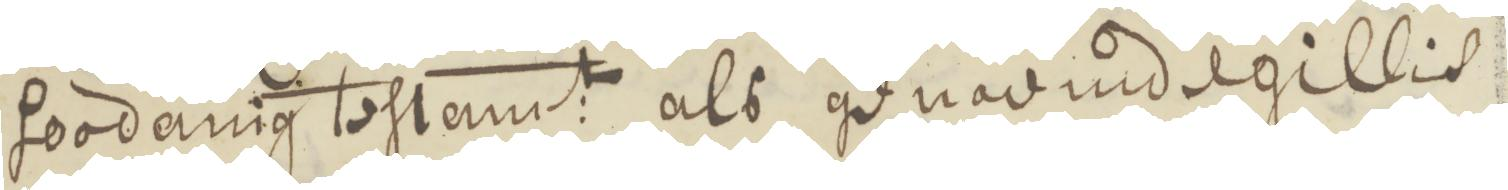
soodanig testem:t als genoemde gillis
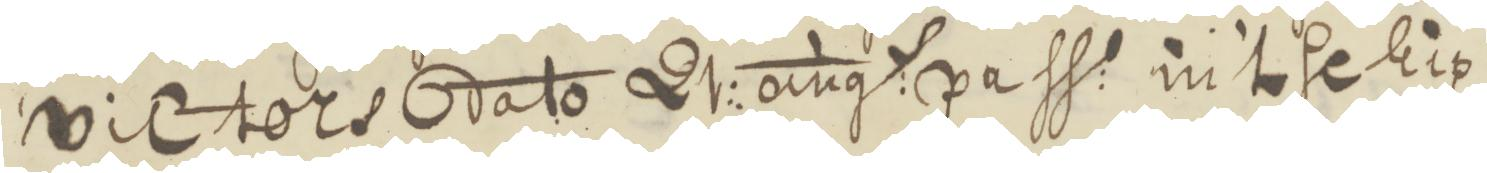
victors dato 21: aug:s pass:o in’t schip
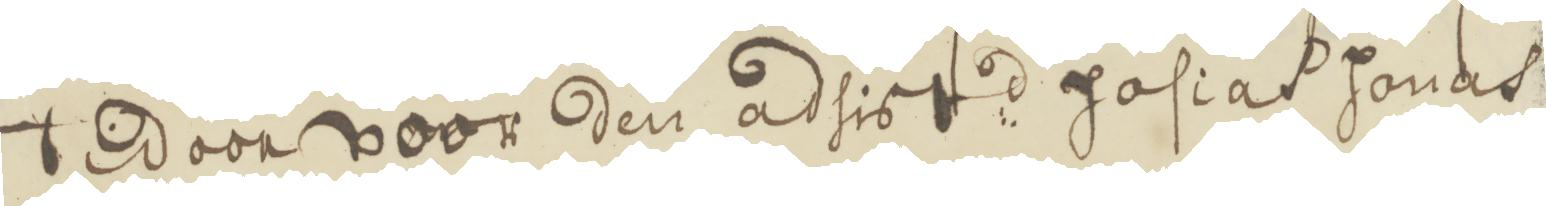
tidoor voor den adsist:d Josias Jonas
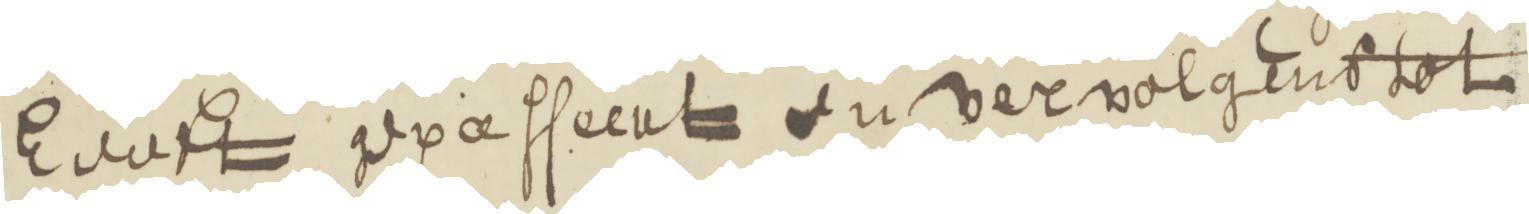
heeft gepasseert en vervolgens tot
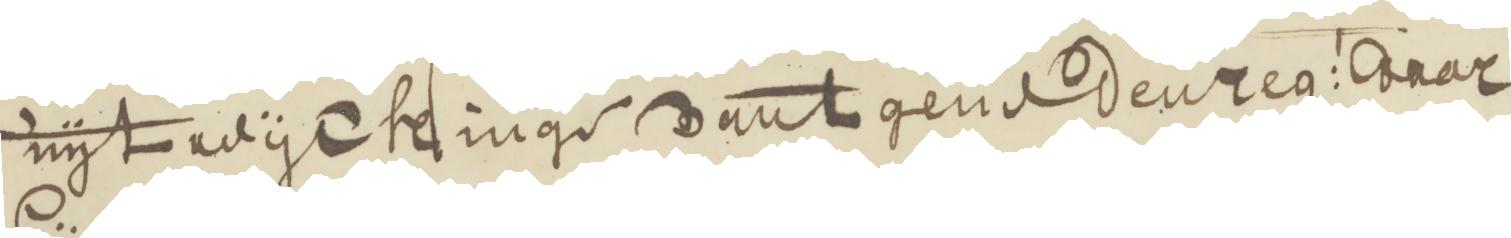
uijtreijckinge vant gene den req:t daar
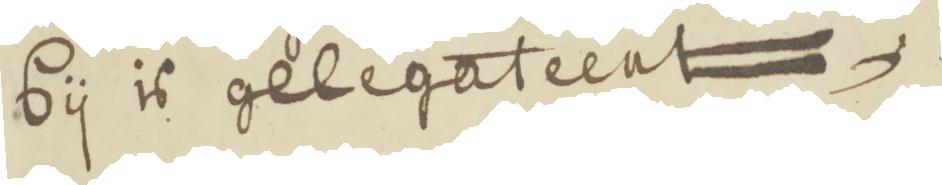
bij is gelegateert,
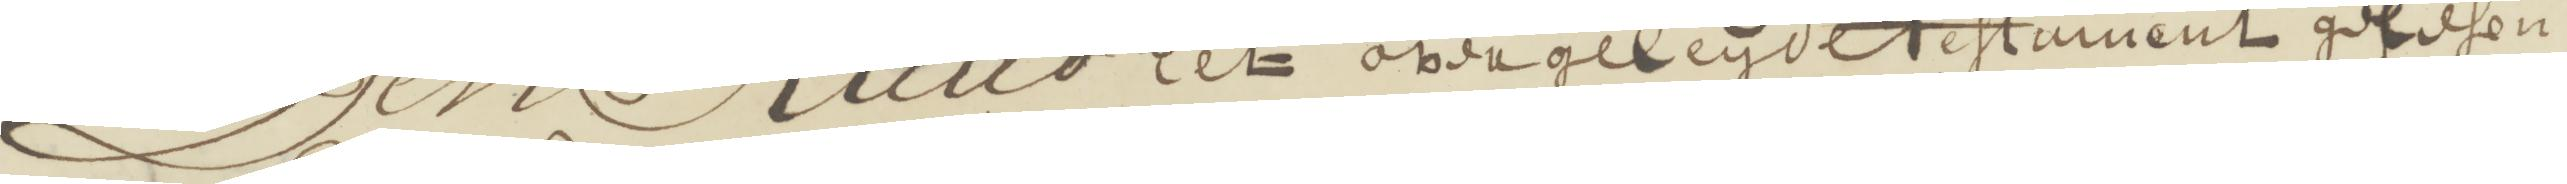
Den Raad het overgeleijde testament gelesen
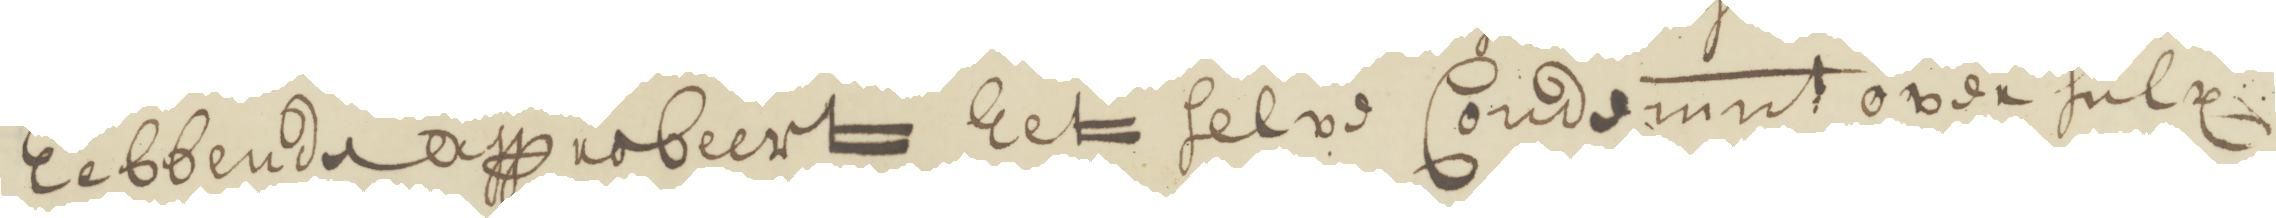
hebbende approbeert het selve Condemn:t over sulx
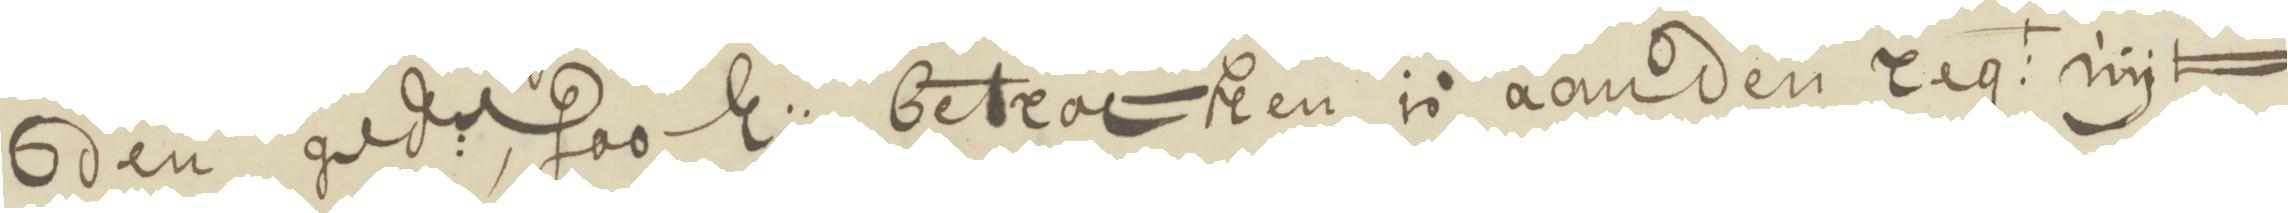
den ged:,e soo hij betrocken is aan den req:t uijt
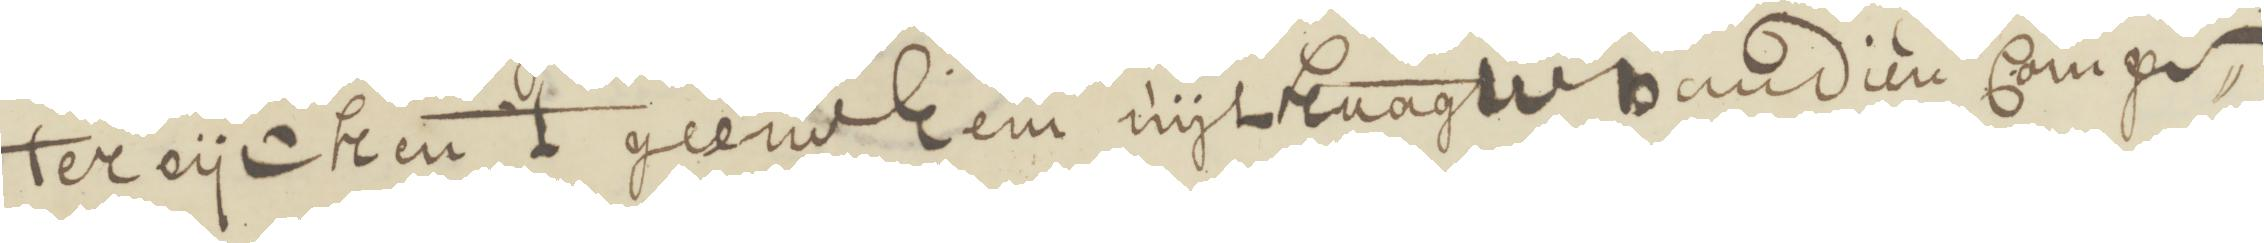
tereijcken ’t geene hem uijtkragte van dien Compe„
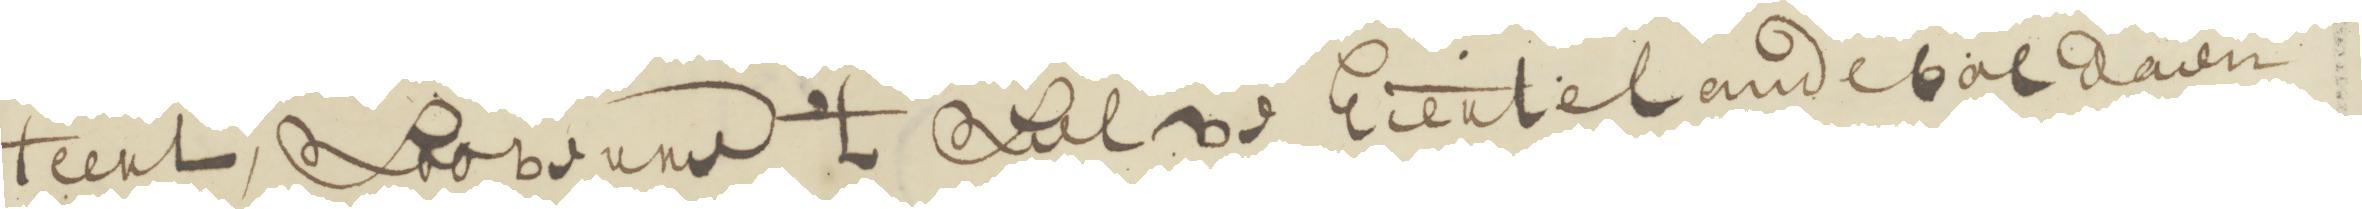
teert, Sooverre ’t Selve hiertelande voldaen
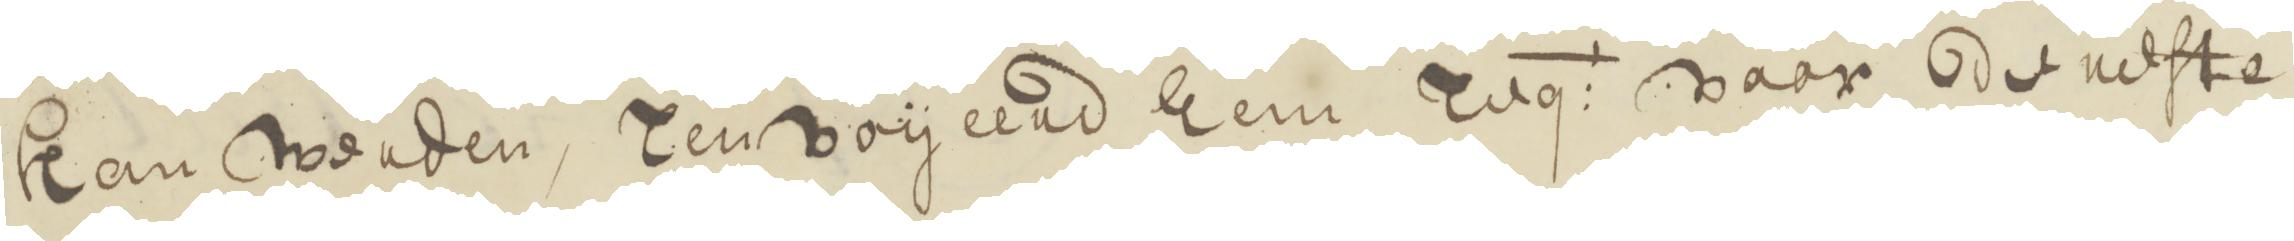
kan werden, renvoijeerd hem req:t voor de reste
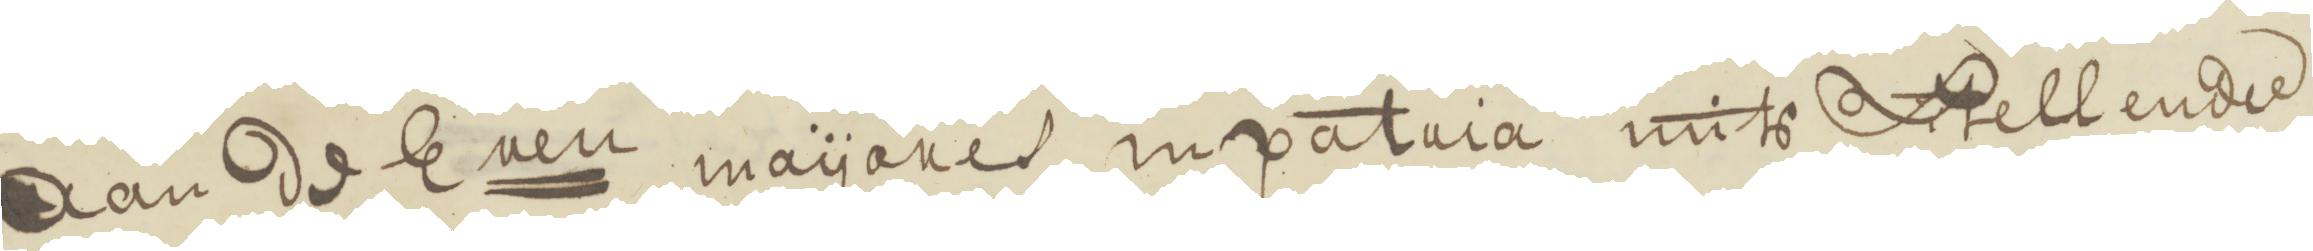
aan de h=ren maijores in patria mits Stellende
